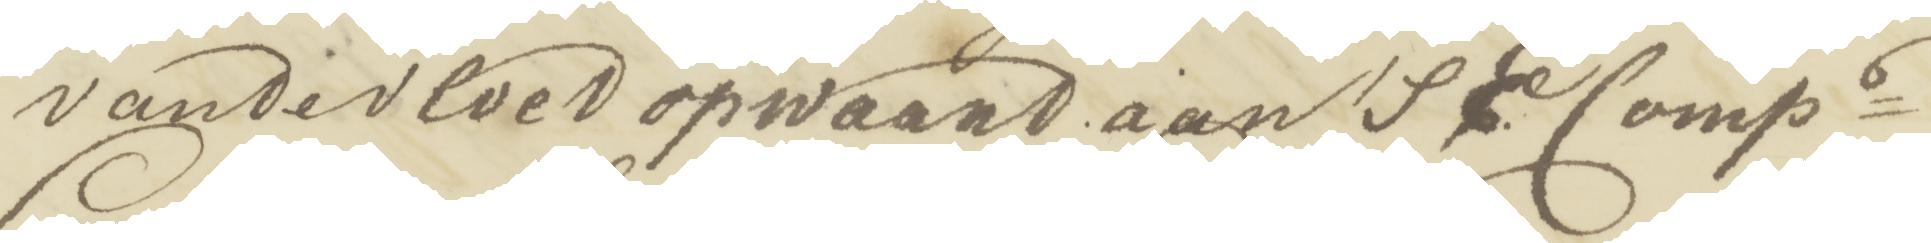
van de vloed opwaard aan ’S E:e Comp=s
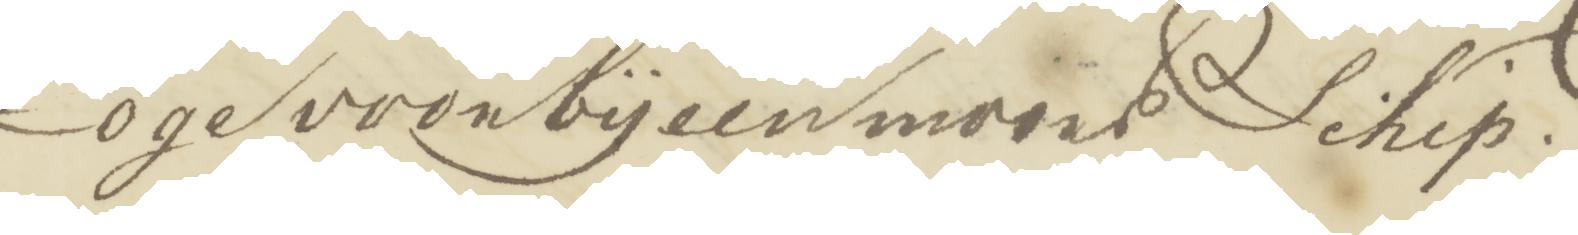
Loge voorbij een moors Schip.
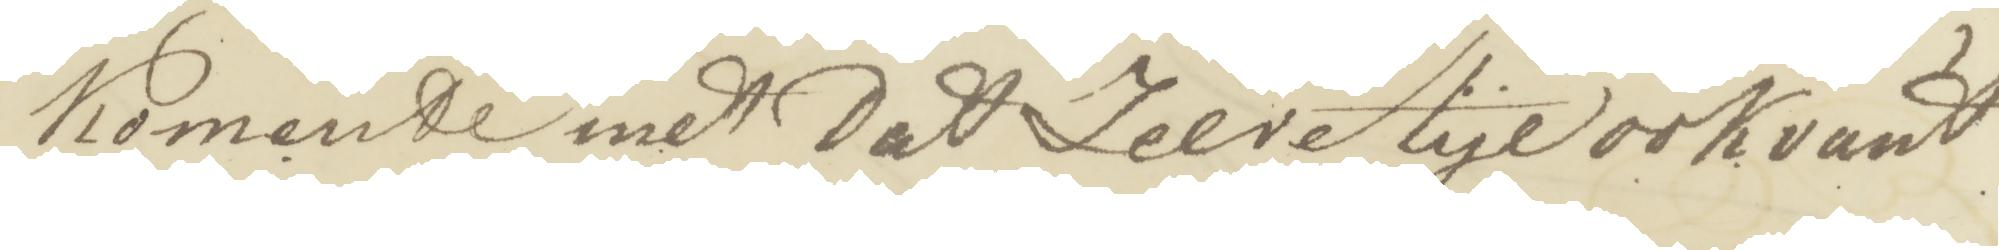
Komende met dat Zelve tije ook van't
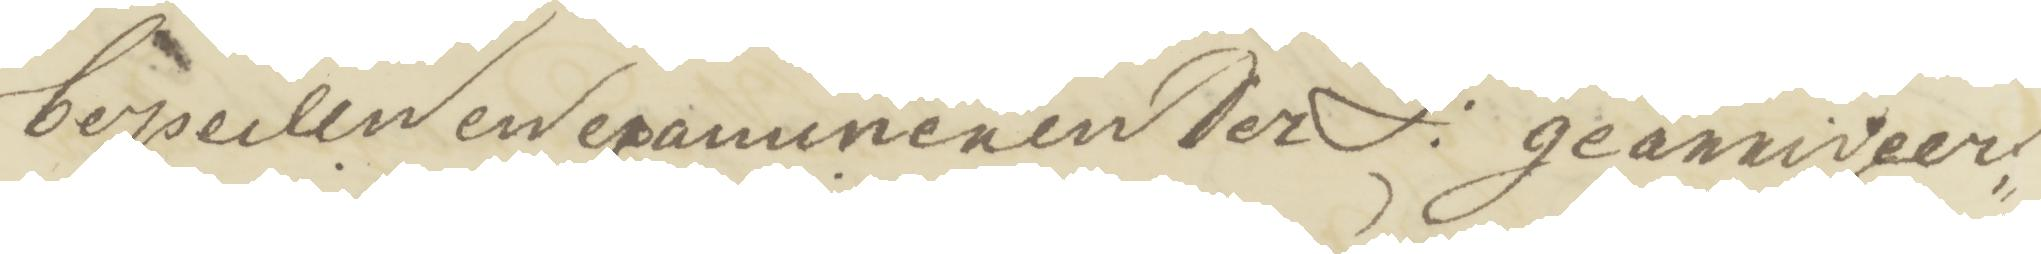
bepeilen en examineren der I:o gearriveer„
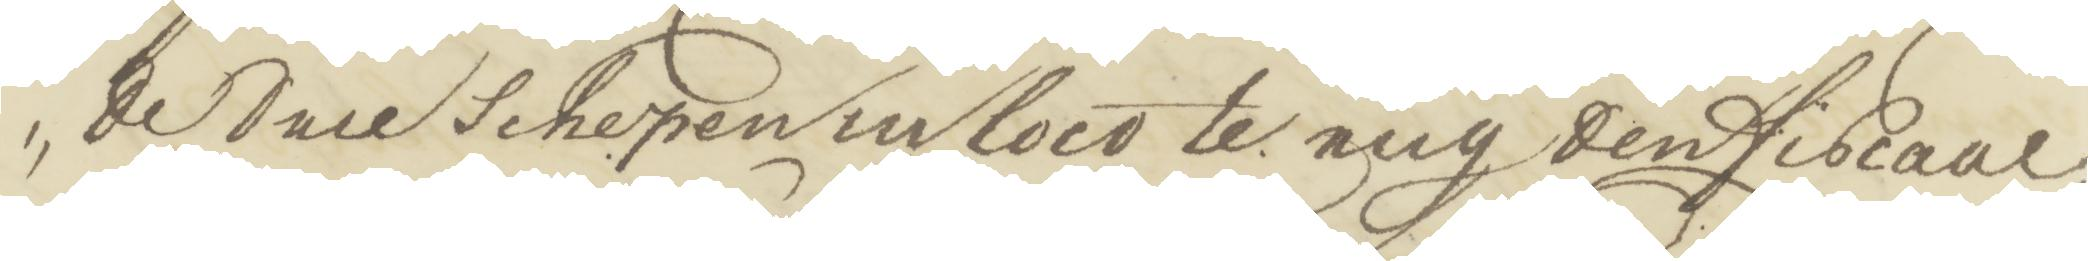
„ de drie schepen in loco terug den fiscaal,
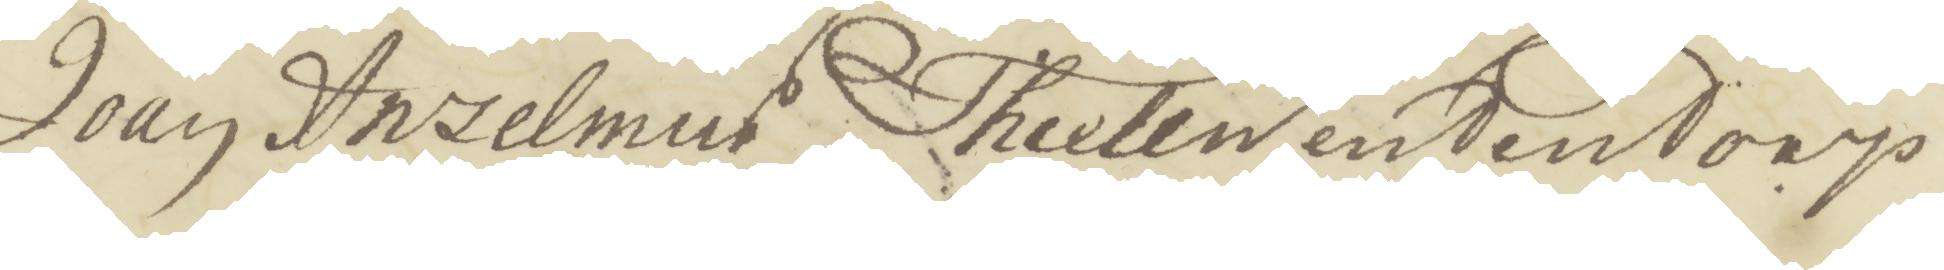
Ioan Anzelmus Thielen en den dorp
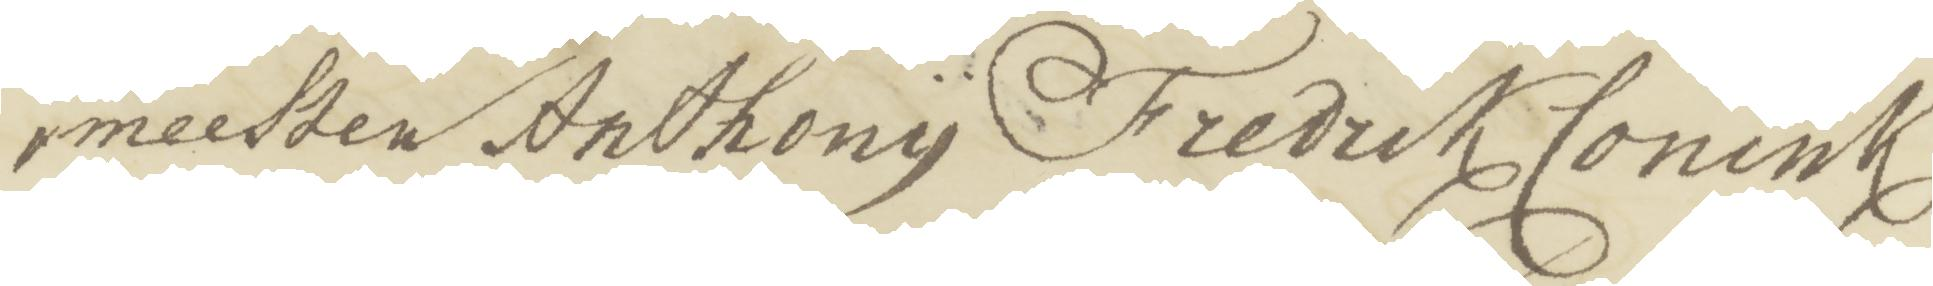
meester Anthonij Fredrik Conink
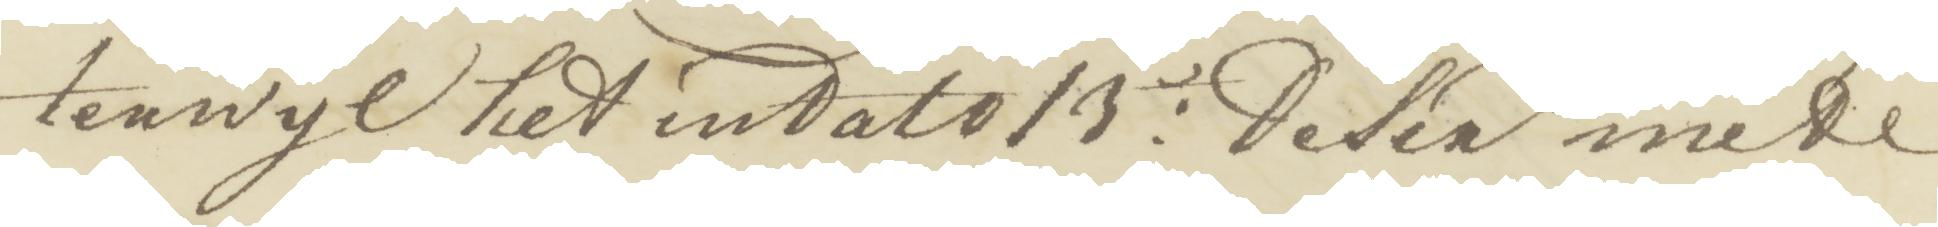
terwijl het indato 13:' deser mede
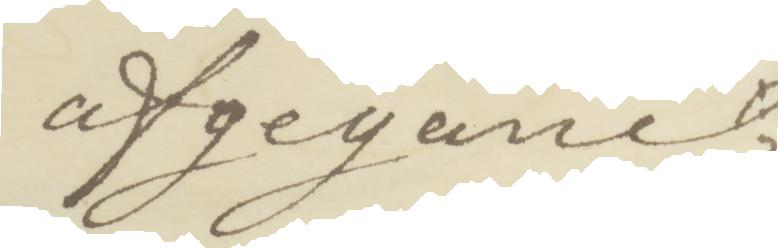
afgegane
